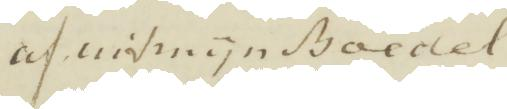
af, uit mijn Boedel
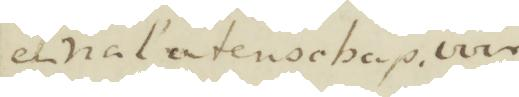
en nalatenschap, voor
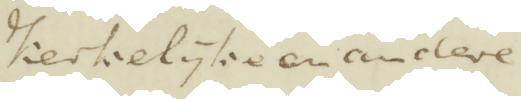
Kerkelijke en andere
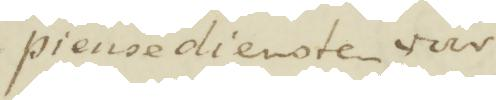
piense diensten voor
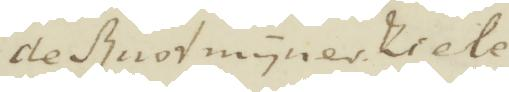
de Rust mijner ziele
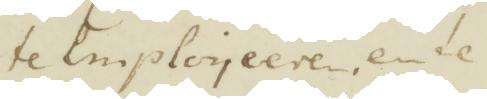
te Emploijeeren, en te
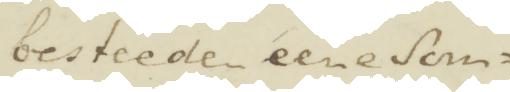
besteeden eene som=
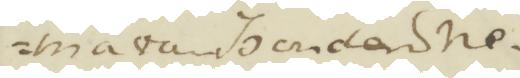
=ma van honderd ne=
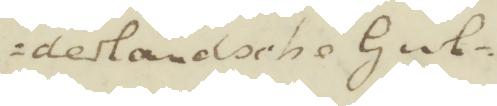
=derlandsche Gul=
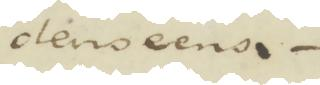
dens eens.
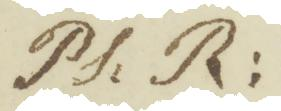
Ps: R:
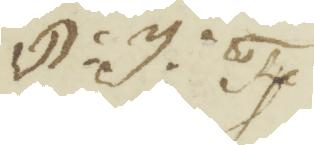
P:J:F
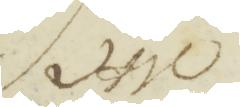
HV
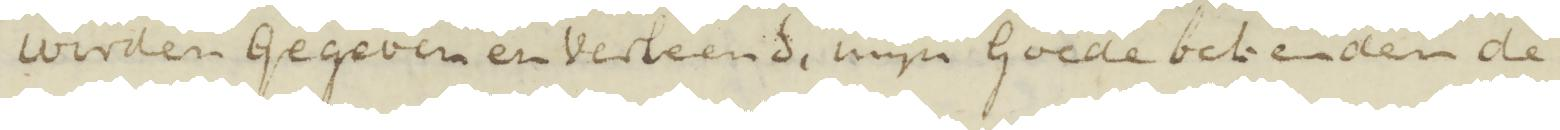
worden gegeven en verleend, myn Goede bekenden de
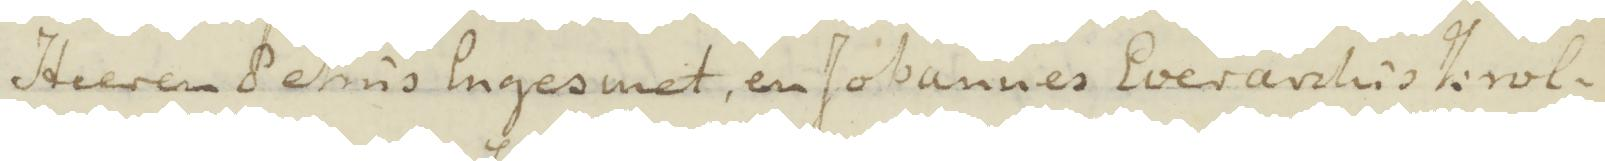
Heeren Petrus Engesmet, en Johannes Everardus Krol=
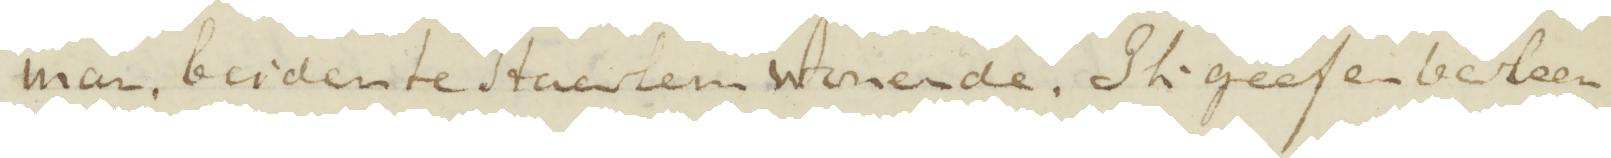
man, beiden te Haarlem wonende. Jk geef en verleen
